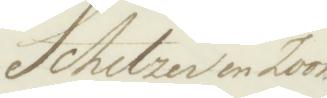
Schetzer en Zoon
